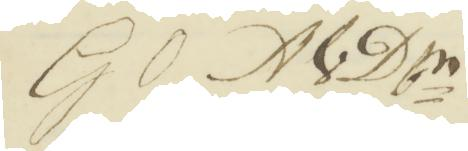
G O AVDj=r
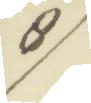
8/
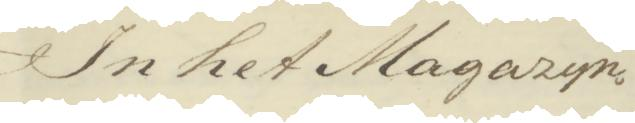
In het Magazyn
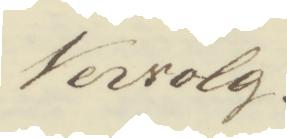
Vervolg
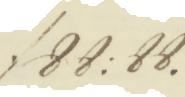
ƒ88:88
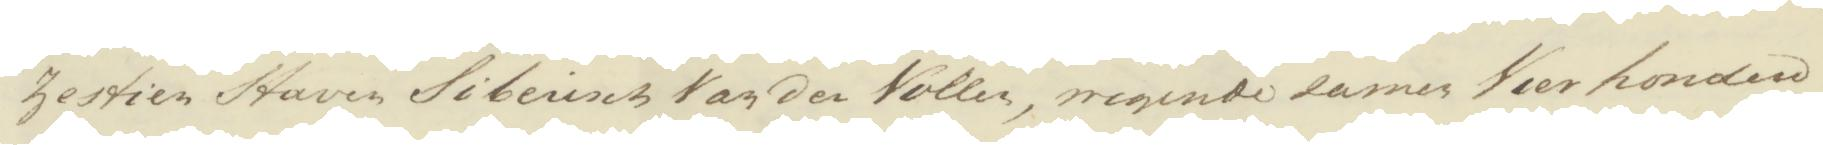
Zestien staven Siberisch van der Vollen, wegende zamen Vier honderd
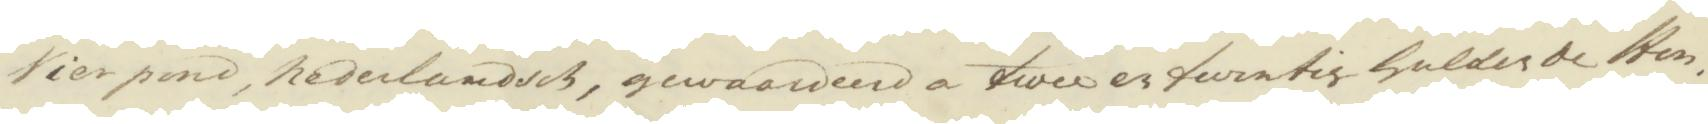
Vier pond, nederlandsch, gewaardeerd a twee en twintig Gulden de Hon
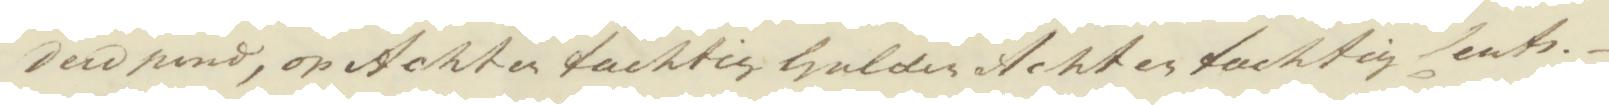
derd pond, op Acht en tachtig Gulden Acht en tachtig Cents.
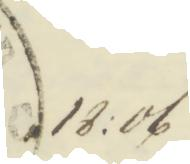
18:06
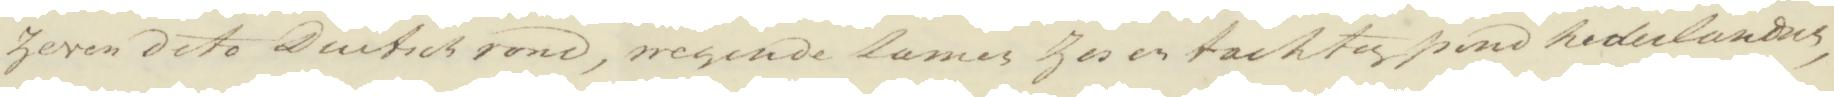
Zeven dito Duitsch vond, wegende zamen zes en tachtig pond nederlandsch
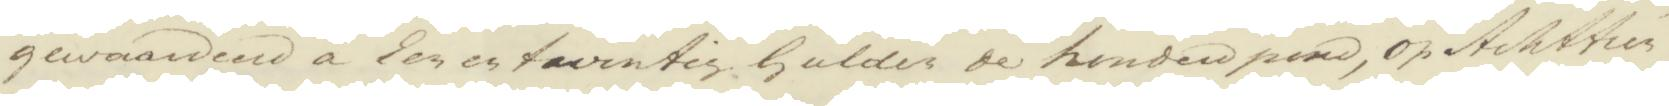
gewaardeerd a Een en twintig Gulden de honderd pond, op Achttien
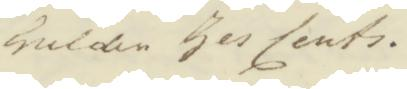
Gulden Zes Cents.
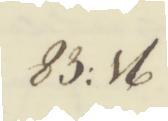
83:16
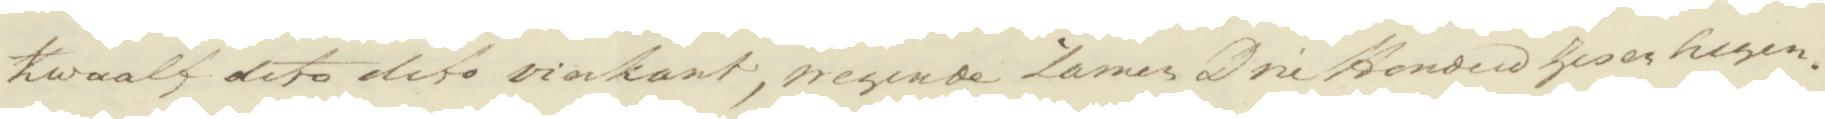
Twaalf dito dito vierkant, wegende zamen Drie Honderd Zes en negen
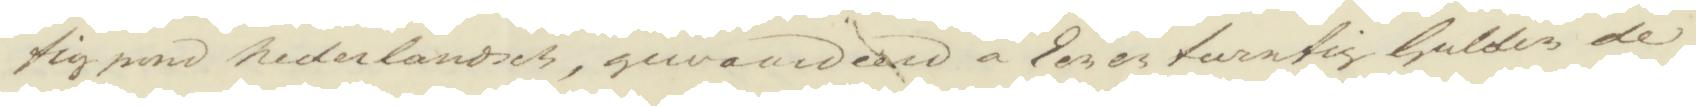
tig pond nederlandsch, gewaardeerd a Een en twintig Gulden de
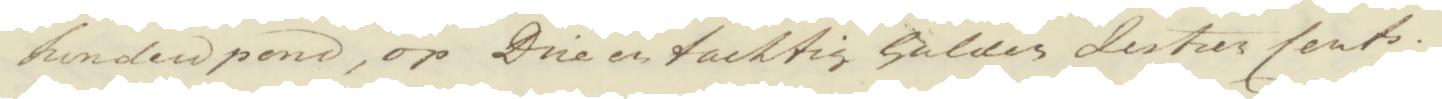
honderd pond, op Drie en tachtig Gulden Zestien Cents.
